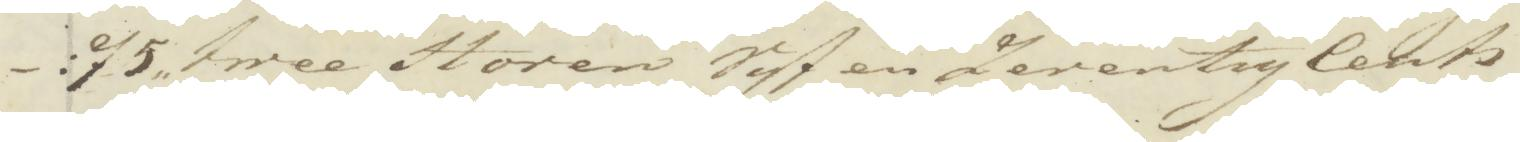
—:75„ twee stoven Vyf en Zeventig Cents
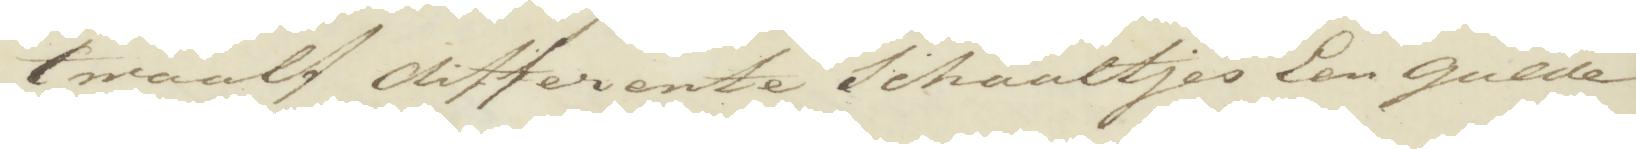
twaalf differente Schaaltjes Een gulde
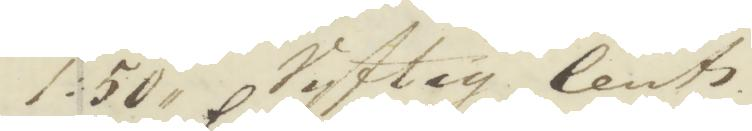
1:50 „ Vyftig Cents.
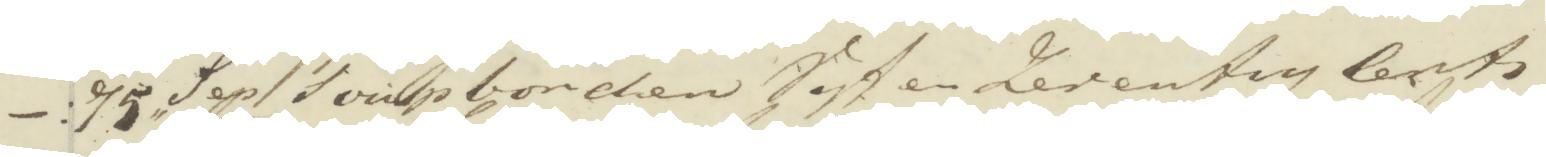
—:75„ Ses soup borden Vyf en Zeventig Cents
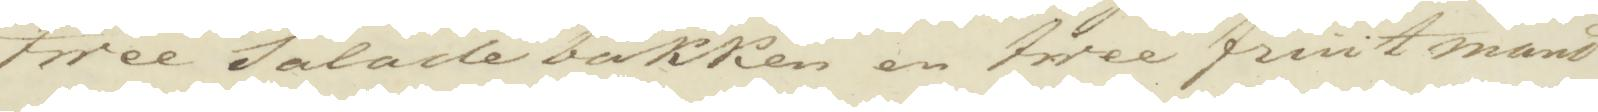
twee Salade bakken en twee fruit mand
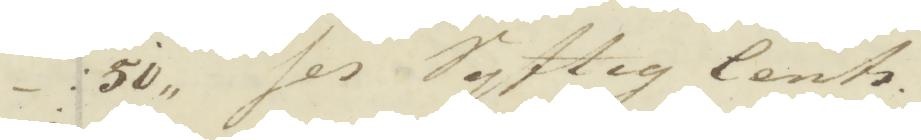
—:50 „ jes Vyftig Cents.
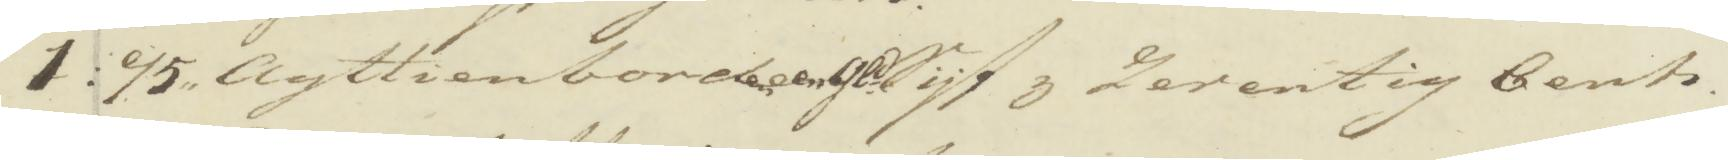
1: 75„ Agttien borden een gl=d Vijf & Zeventig Cents.
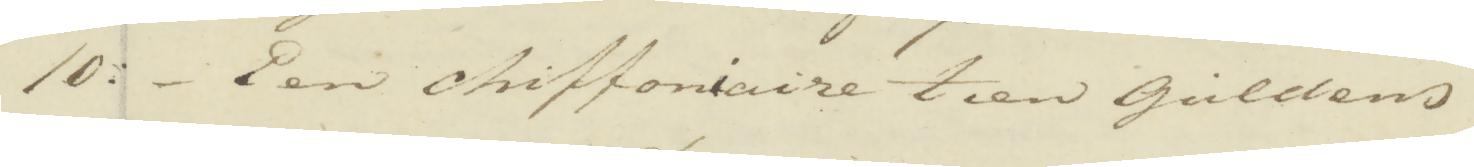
10: — Een chiffoniaire tien guldens
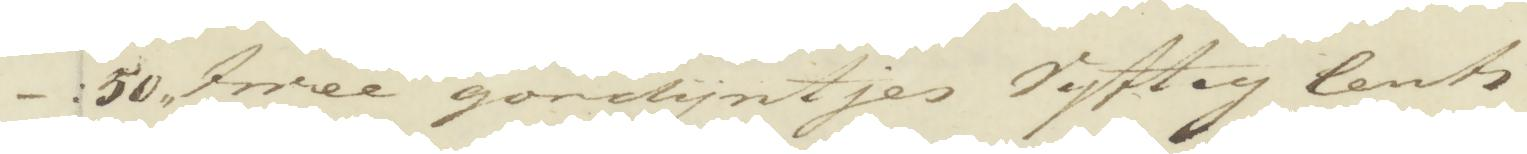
—:50„ twee gordijntjes Vyftig Cents
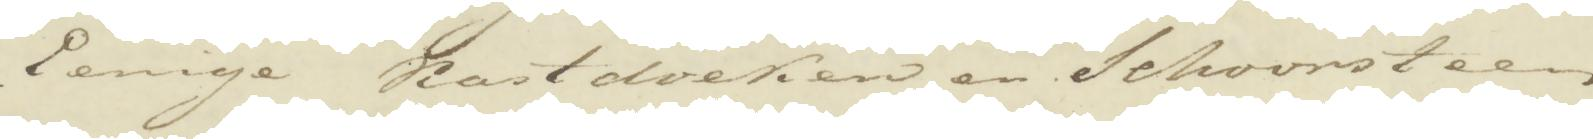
Eenige kastdoeken en schoorsteen
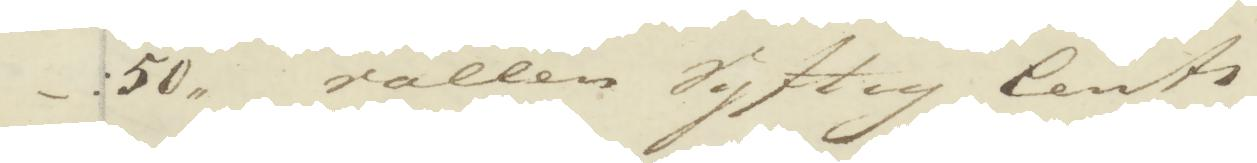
—:50„ vallen Vyftig Cents
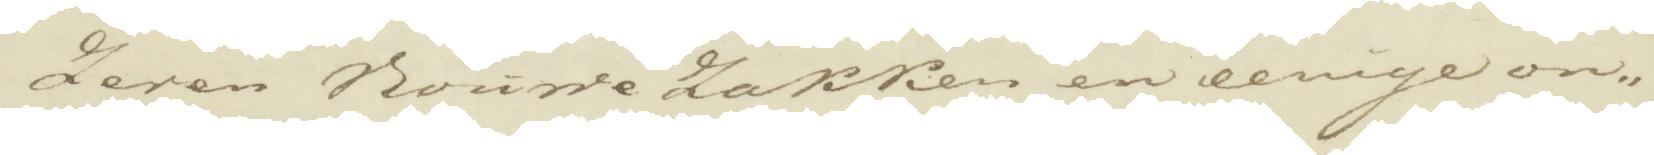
Zeven Vrouwe Zakken en eenige on„
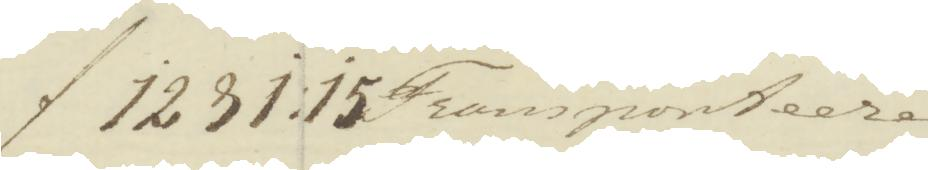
ƒ1231:15 Transporteere
